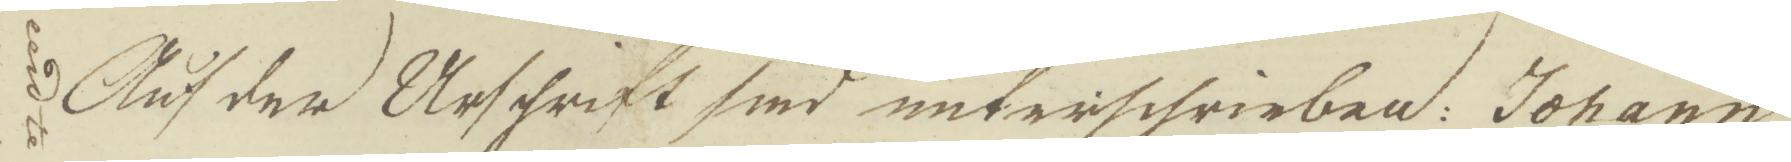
Auf der Urschrift sind unterschrieben: Johann
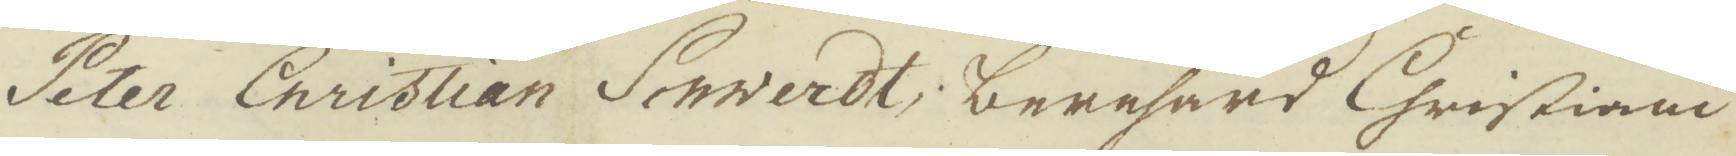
Peter Christian Schwerdt; bewesend Christiaan
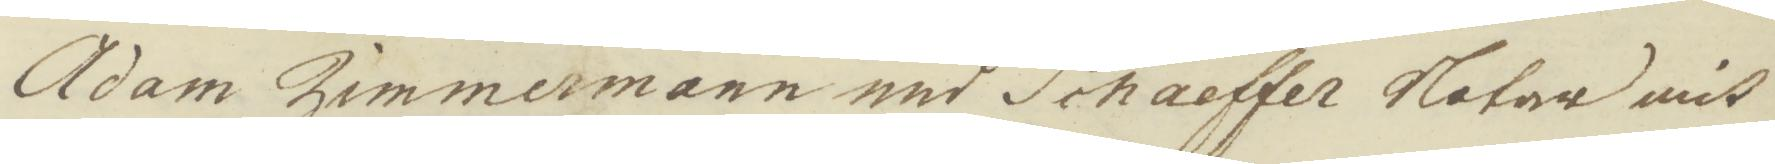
Adam Zimmermann und Schaeffer Nalsee mit
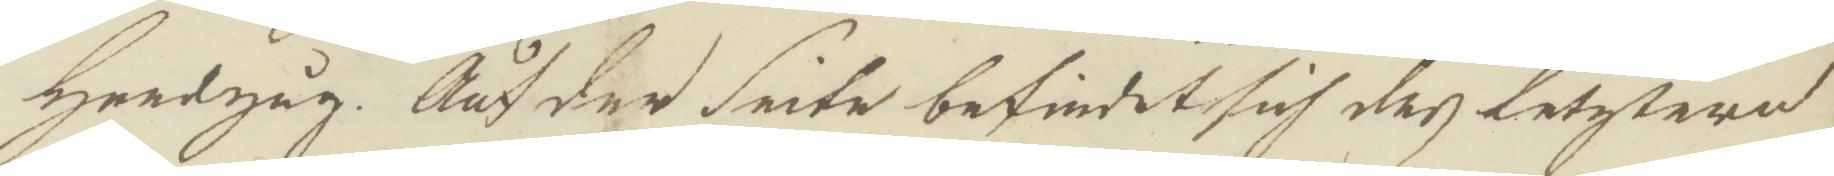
handzug. Auf der seite befindet sich den letzteren
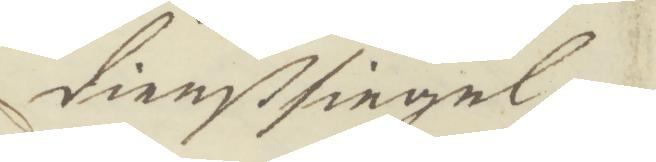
dienstsiegel.
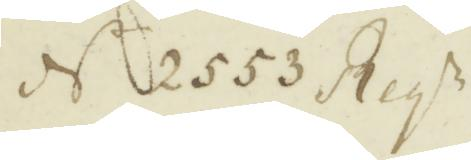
N 2553 Regt
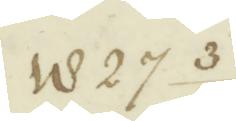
18 27 3/7
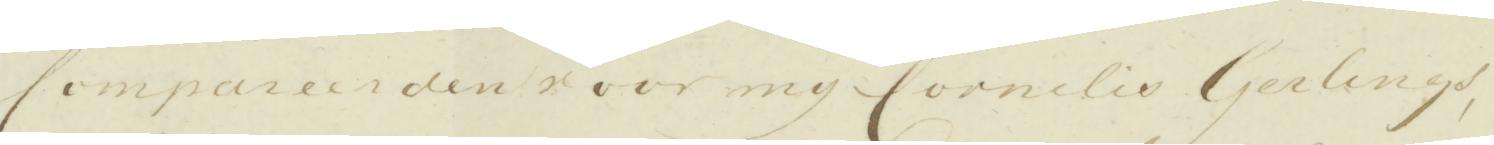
Compareerden voor my Cornilis Gerlings,
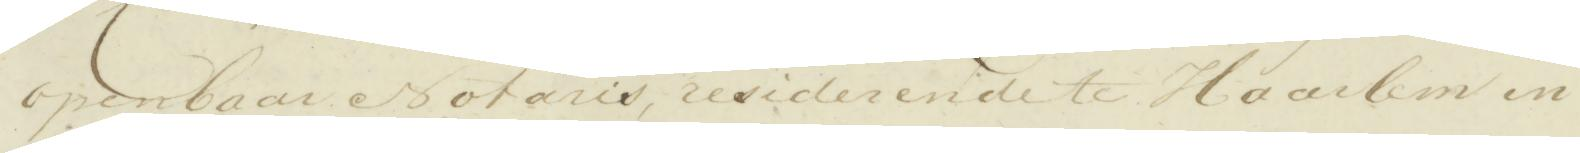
openbaar Notaris, residerende te Haarlem in
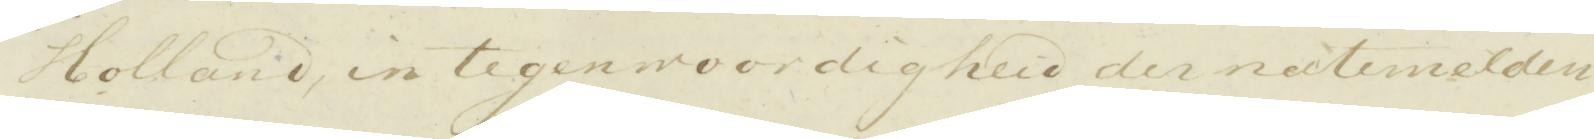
Holland, in tegenwoordigheid der natemelden
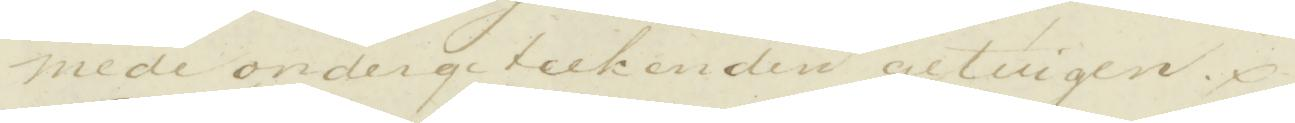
mede ondergeteekenden getuigen.
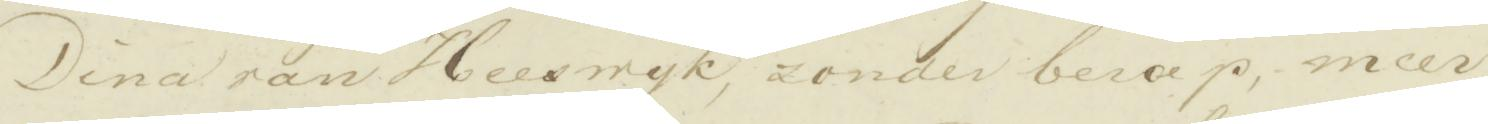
Dina van Heeswjk, zonder beroep, meer
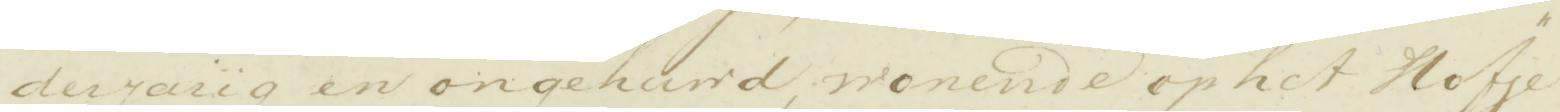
derjarig en ongehuwd wonende op het Hofje
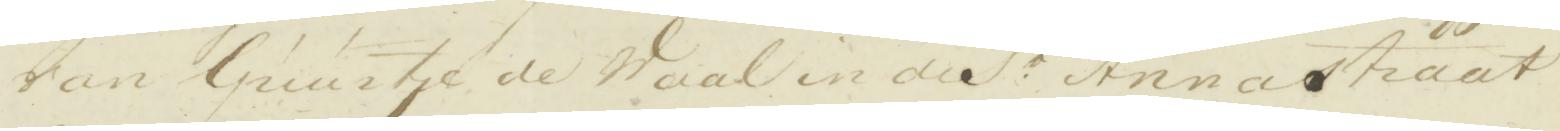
van Guurtje de Waal in de S.t Annastraat
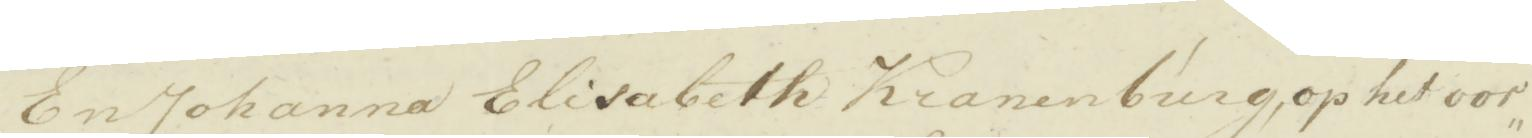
En Johanna Elisabeth Kranenburg, op het oor„
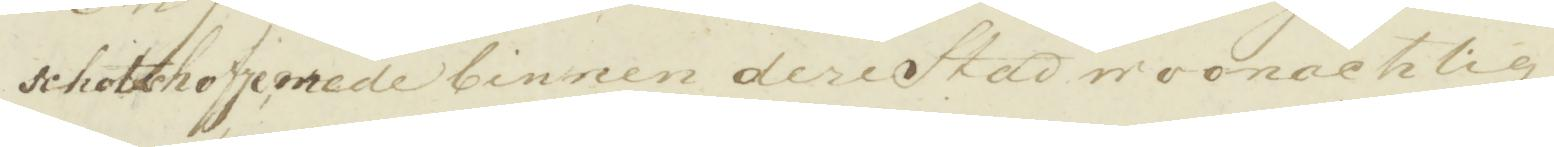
schotshofje, mede binnen deze stad woonachtig,
